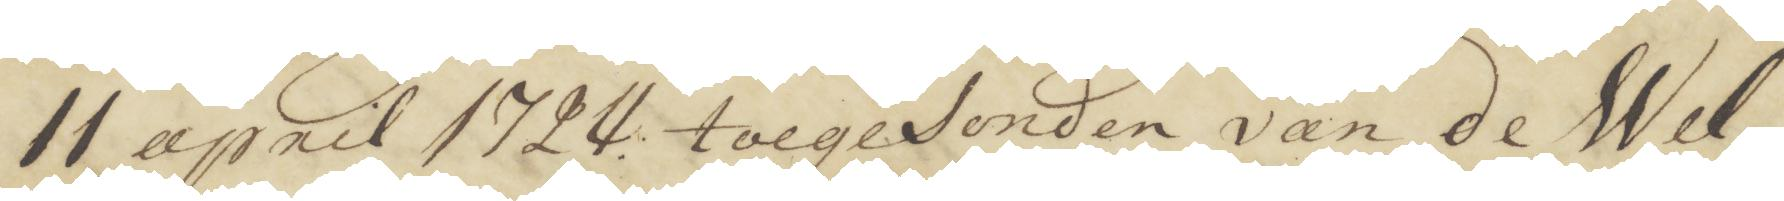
11 april 1724: toegesonden van de Wel.
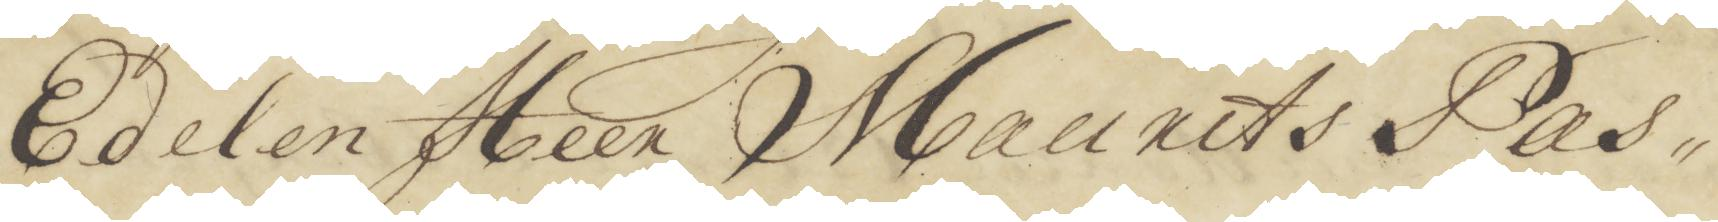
Edelen Heer Maurits Pas„
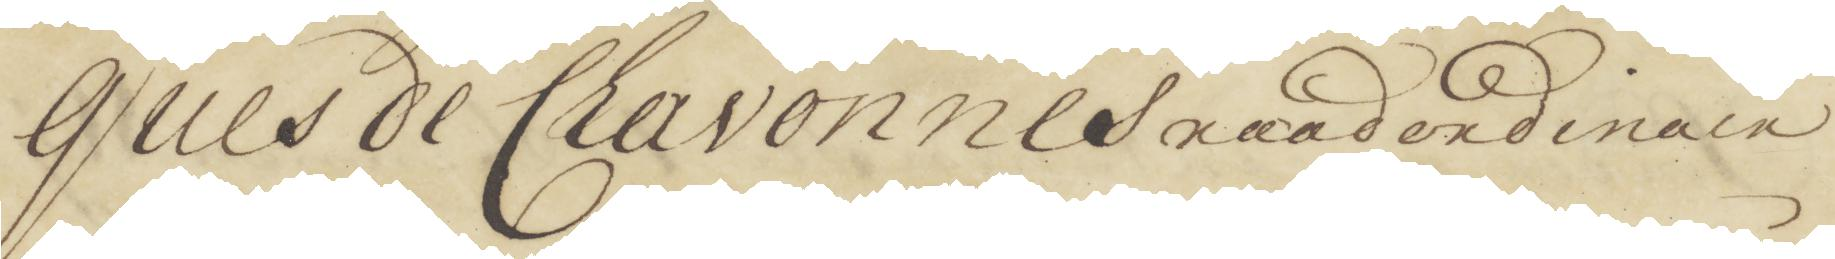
ques de Chavonnes raad ordinair
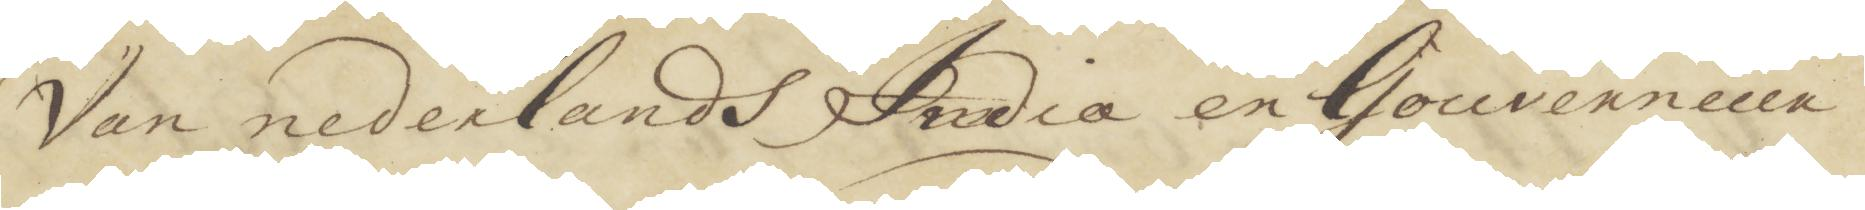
van nederlands India en Gouverneur
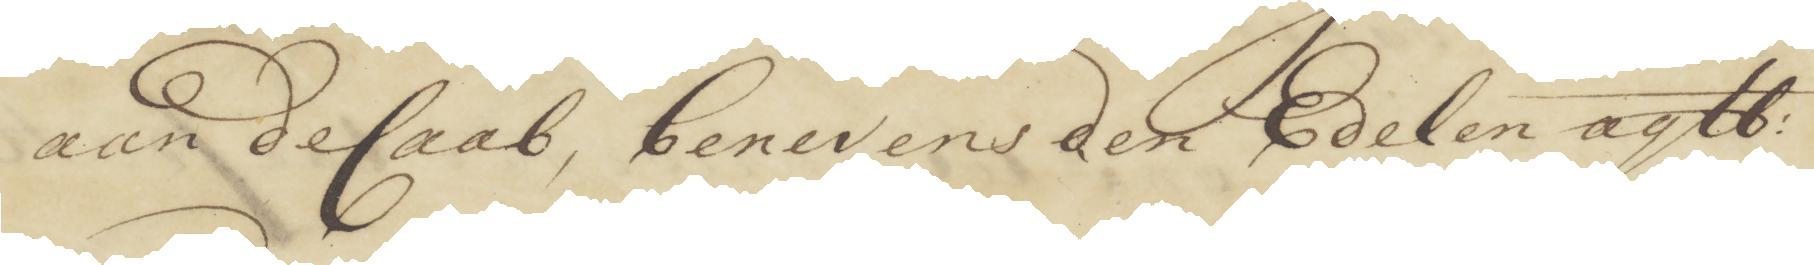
aan de Caab, benevens den Edelen agtb:
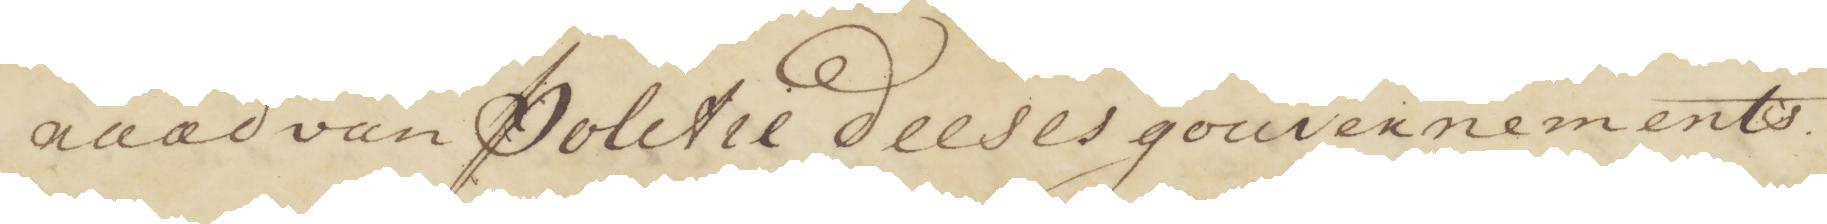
raad van Politie deeses gouvernements.
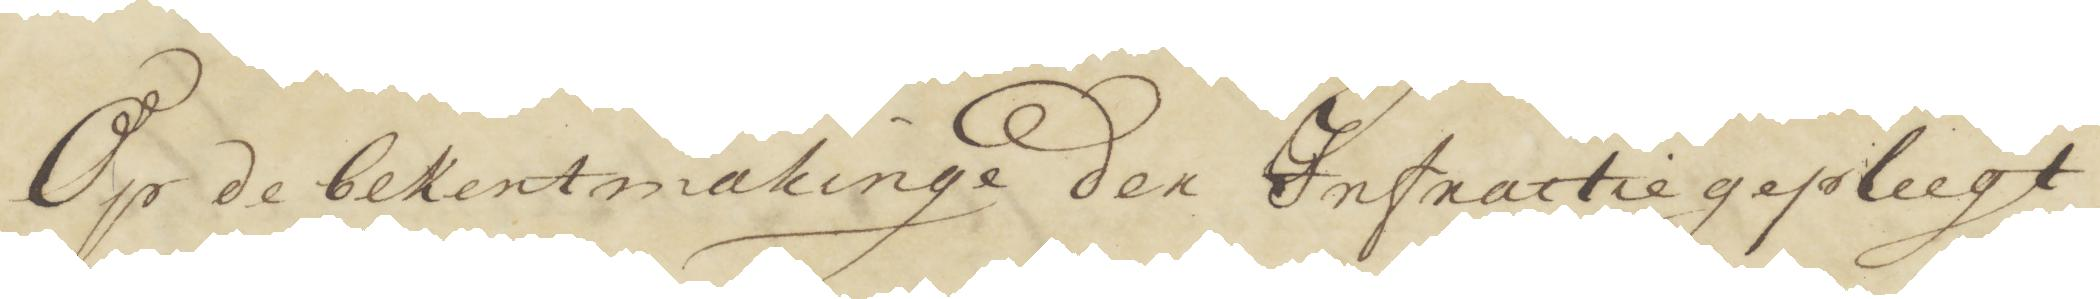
Op de bekentmakinge der Infractie gepleegt
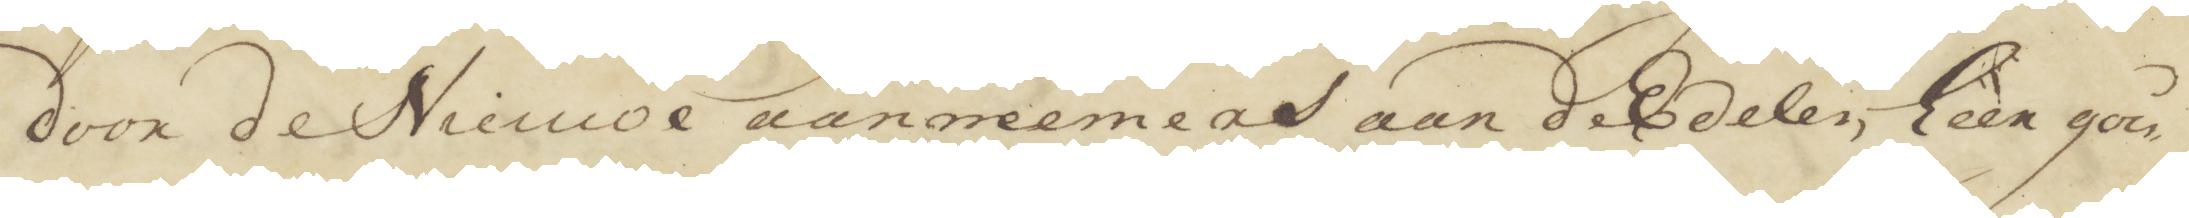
door de Nieuwe aanneemers aan de Edelen heer gou,
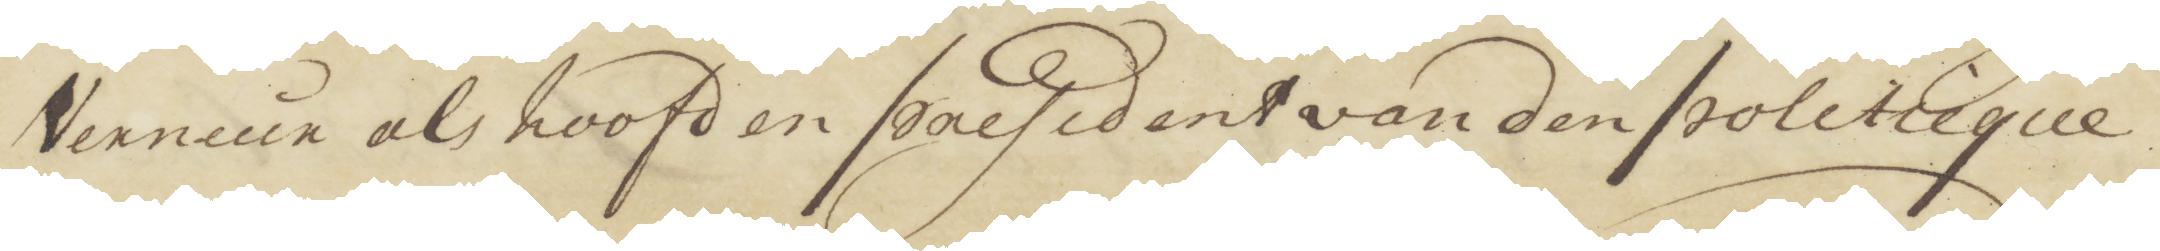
verneur als hoofd en president van den politieque
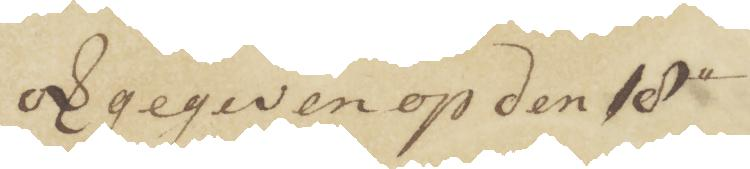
overgegeven op den 18"
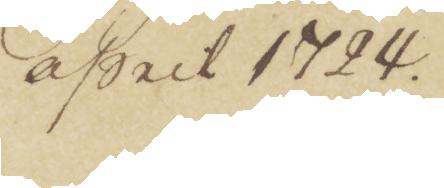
april 1724.
